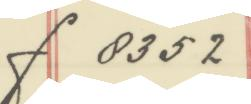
ƒ 8352
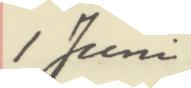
1 Juni
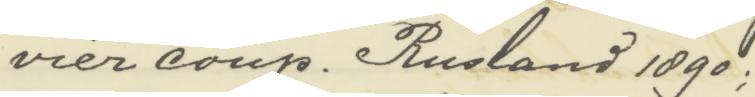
vier coup. Rusland 1890;
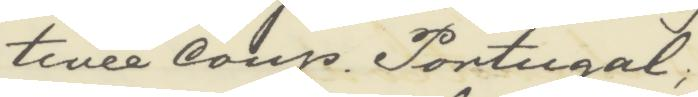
twee coup. Portugal;
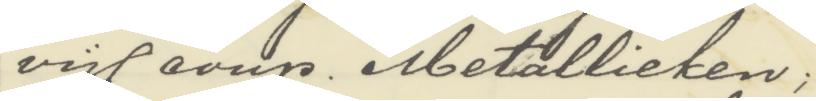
vijf coup. Metallieken;
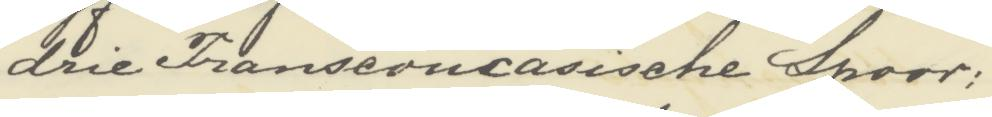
Drie Transcoucasische Spoor;
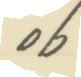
06
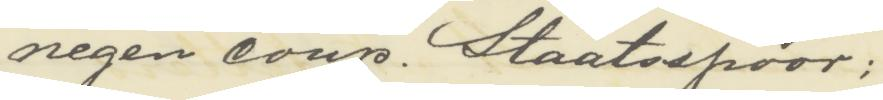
negen coup. Staatsspoor;
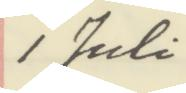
1 Juli
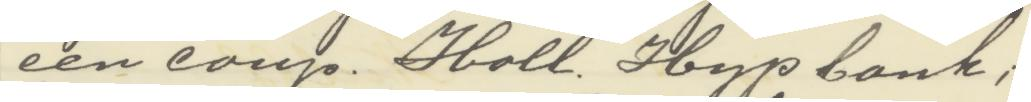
een coup. Holl. Hyp bank;
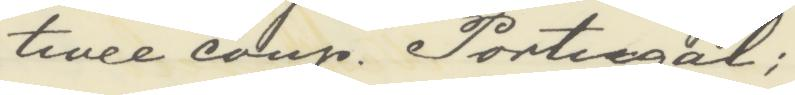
twee coup. Portugal:
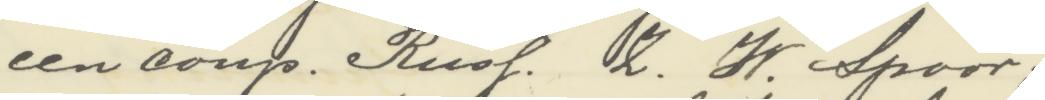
een coup. Russ. Z. H. Spoor;
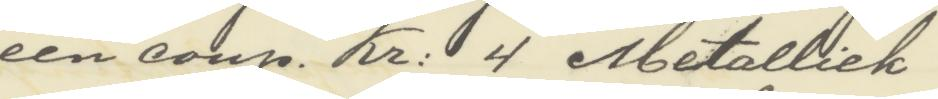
een coup. Kr: 4 Metalliek
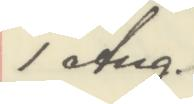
1 Aug.
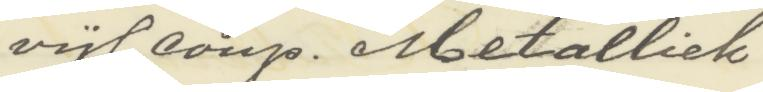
vijf coup. Metalliek
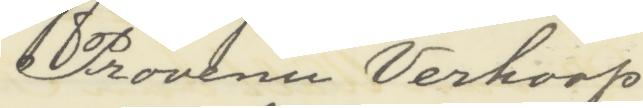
Provenu Verkoop
